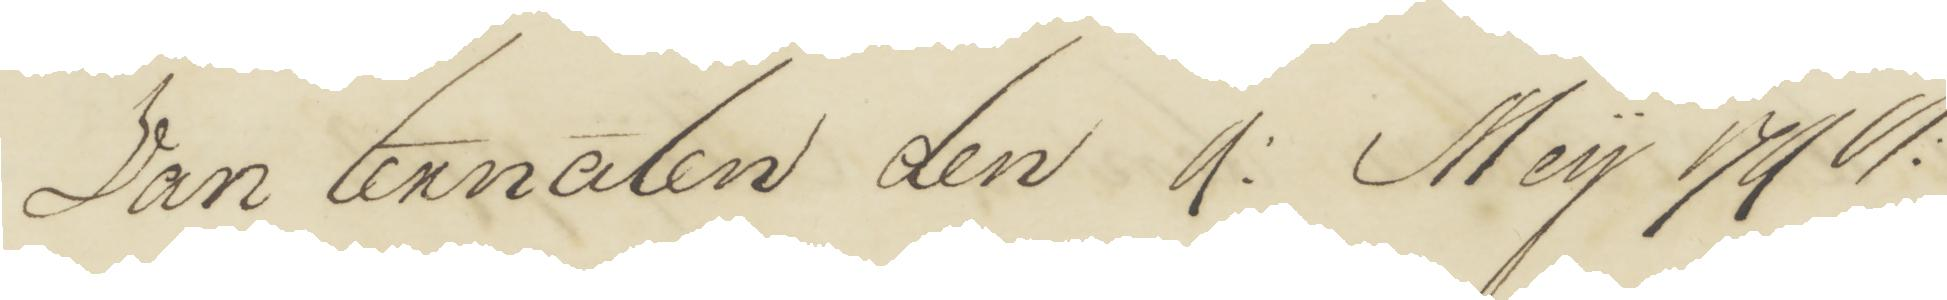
Van ternaten den 4: Meij 1748:
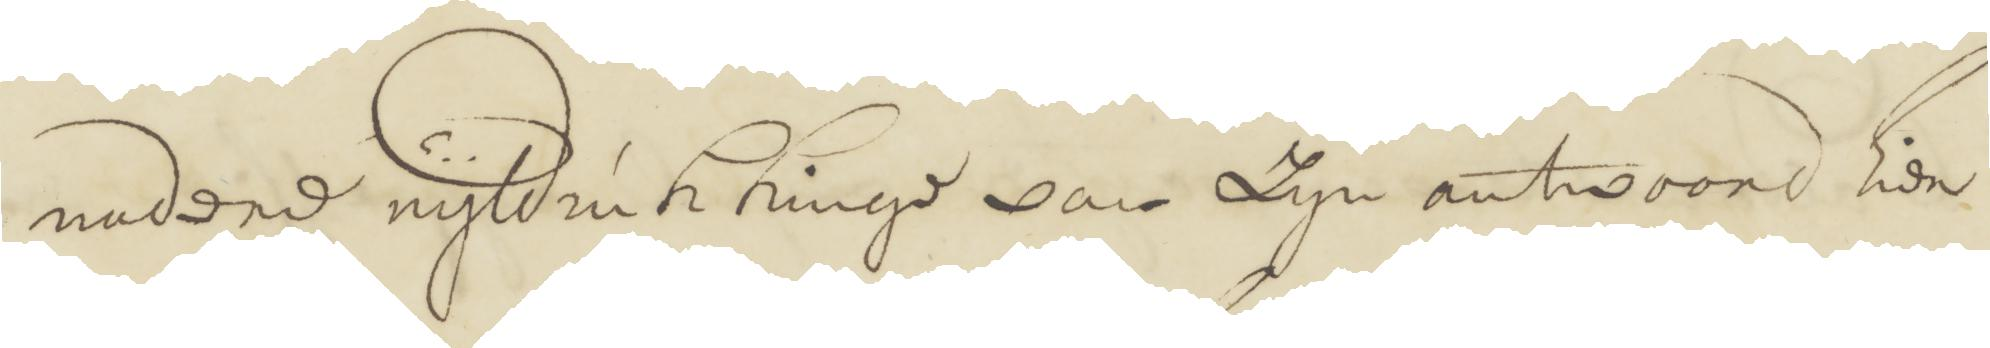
nadere uijtdrukkinge van zijn antwoord hier
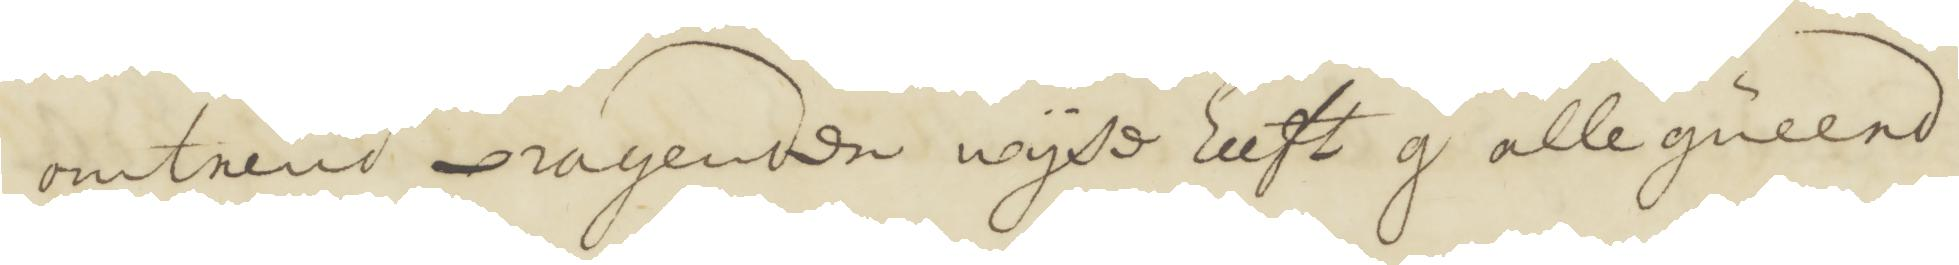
omtrend vragenden wijse heeft g’allegueerd
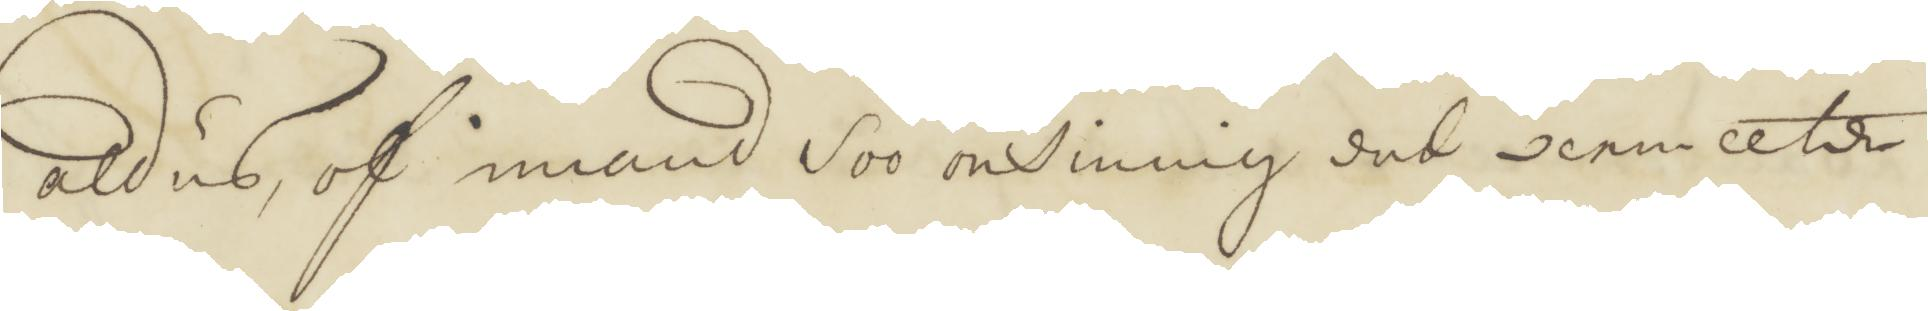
aldus, of imand soo onsinnig end vermeeten
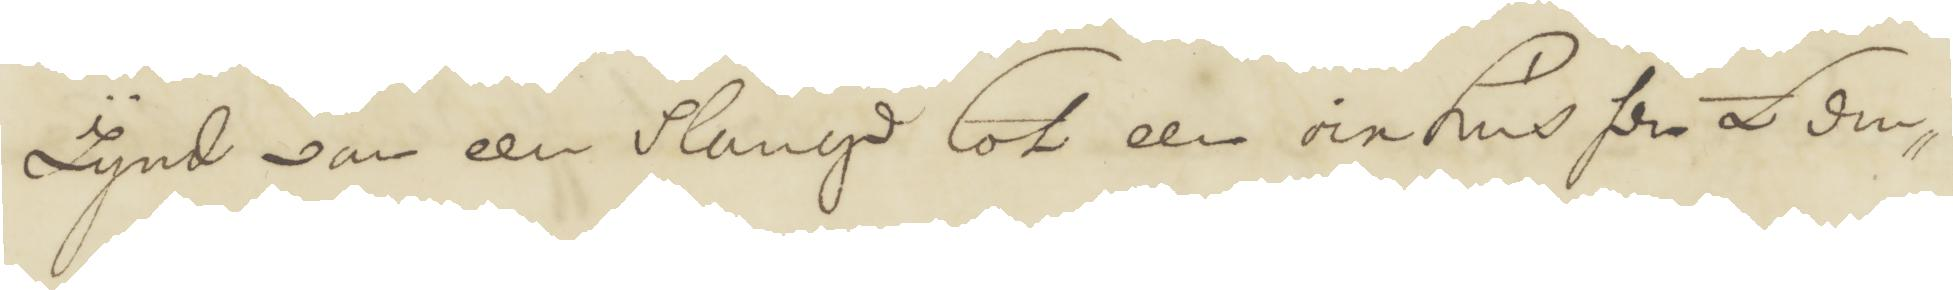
zijnd van een slange tot een oirkussen t em„
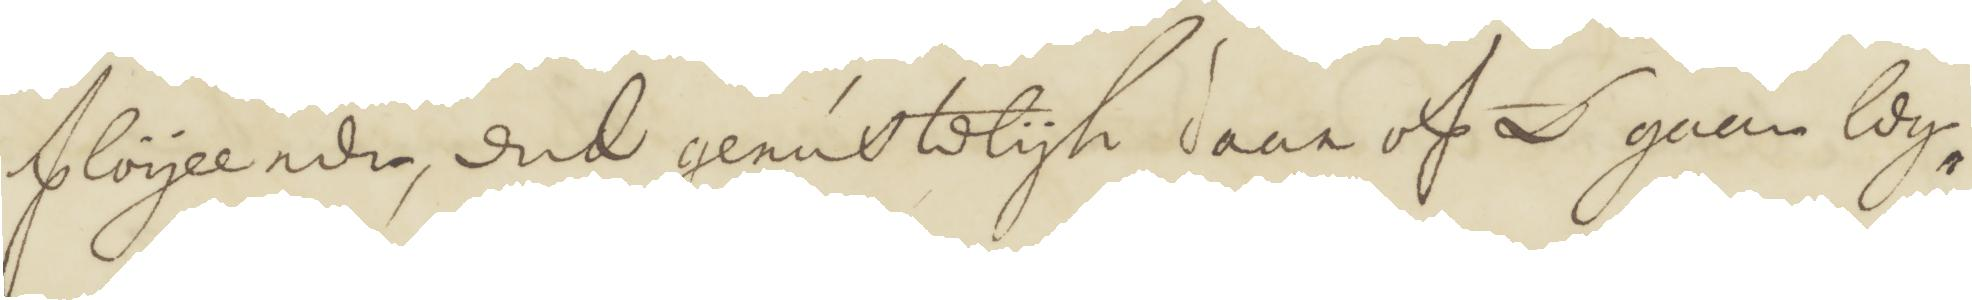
ploijeeren, end gerustelijk daar op t gaan leg„
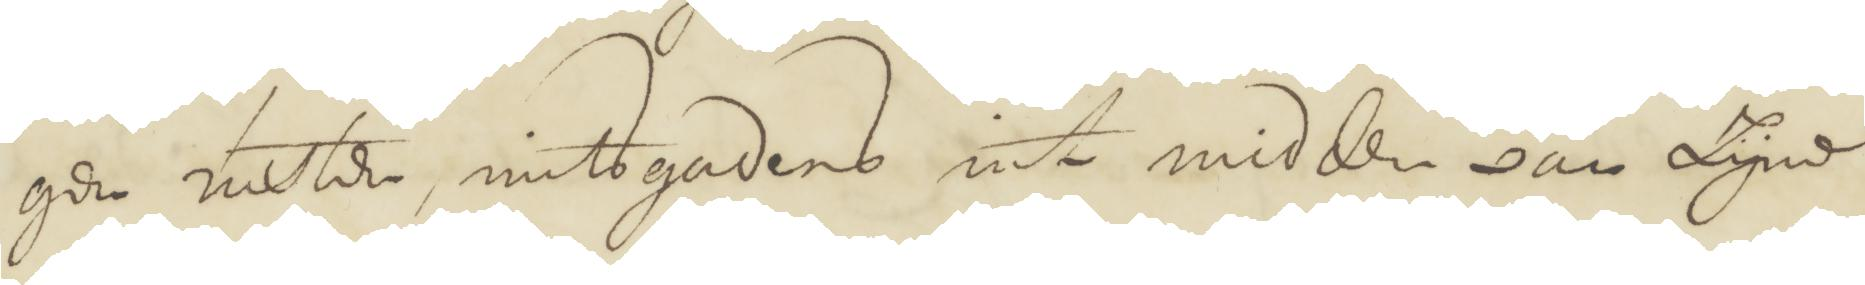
gen rusten, mitsgaders in't midden van zijne
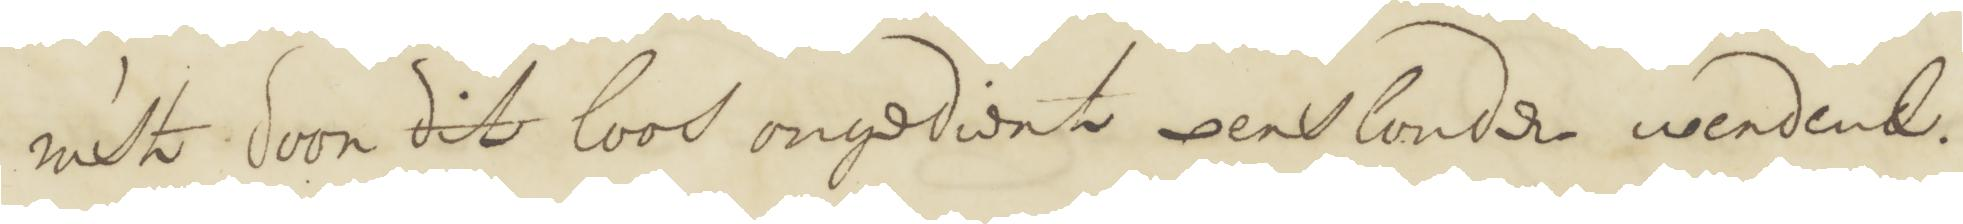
rust door dit loos ongediert verslonden werdend.
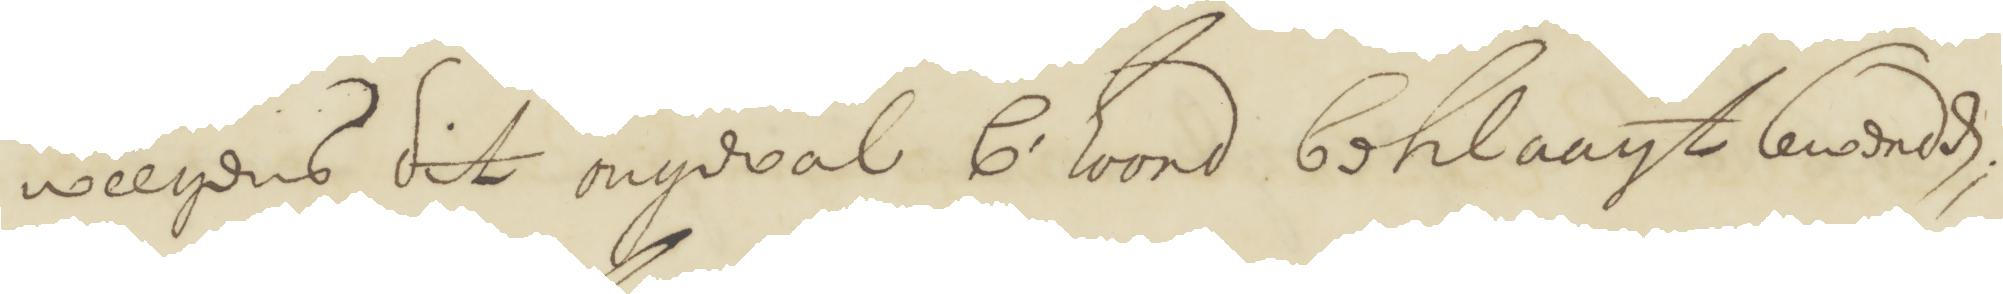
weegens dit ongeval b'hoord beklaagt tewerden,
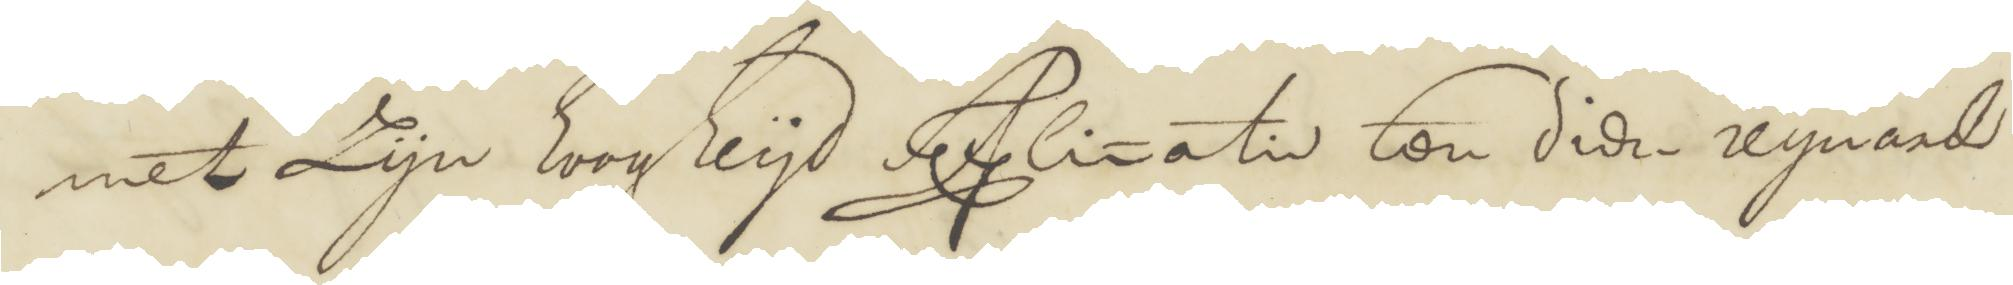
met zijn hoogheijd Explicatie ten dien reguard
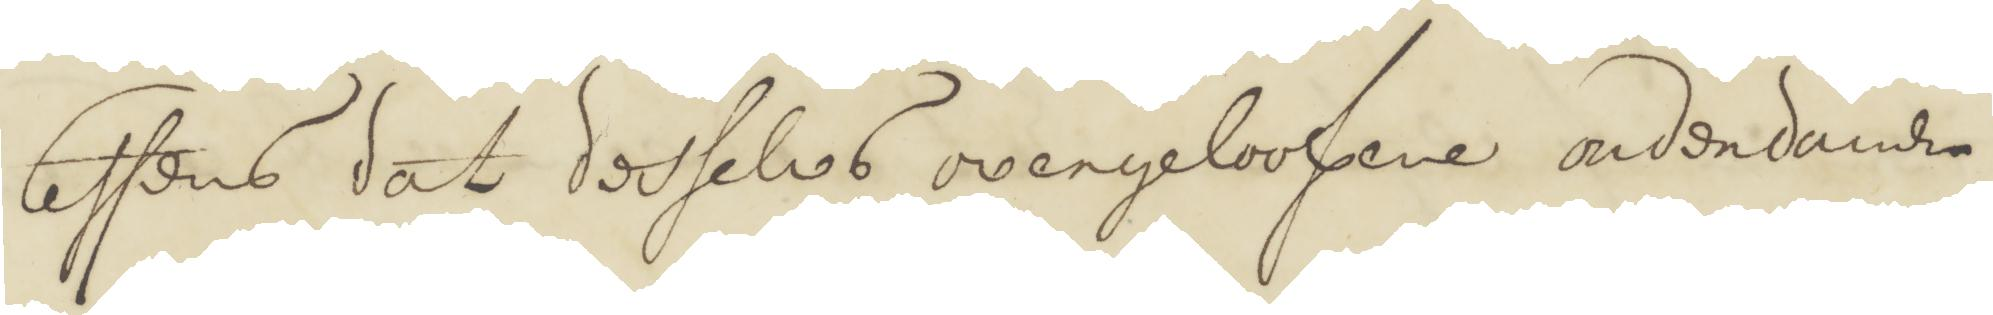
teffens dat desselvs overgeloopene onderdanen
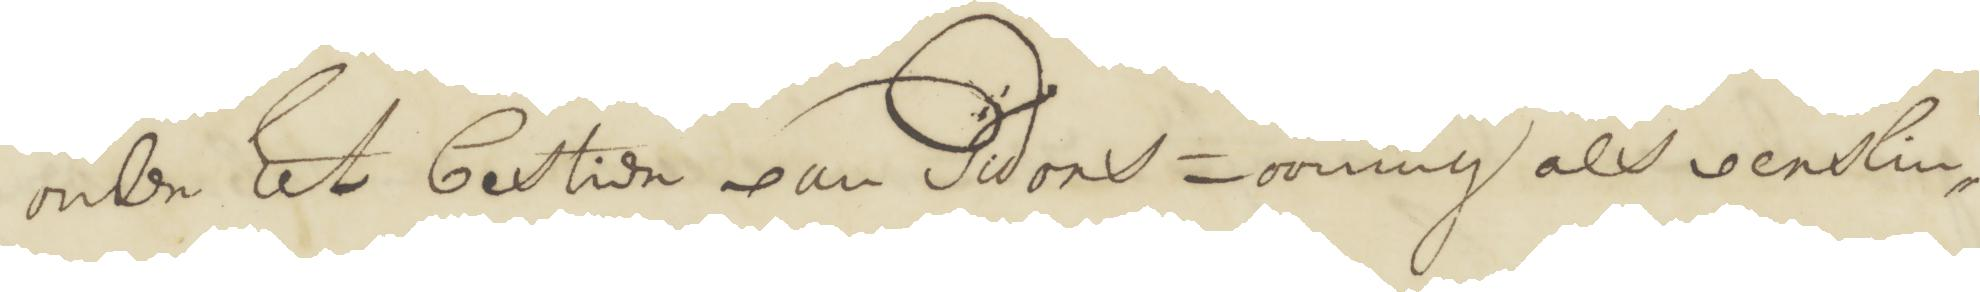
onder het bestier van Tidors cooning als verslin„
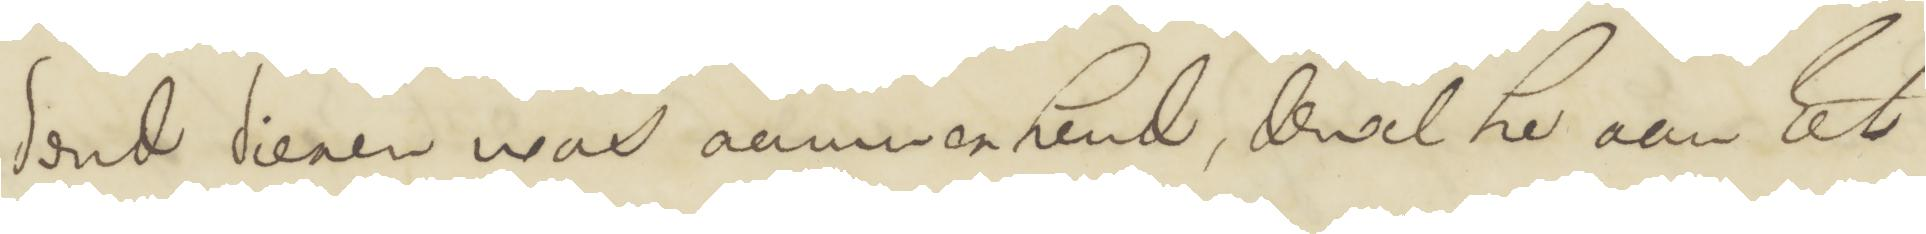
dend dieren was aanmerkend, dewelke aan het
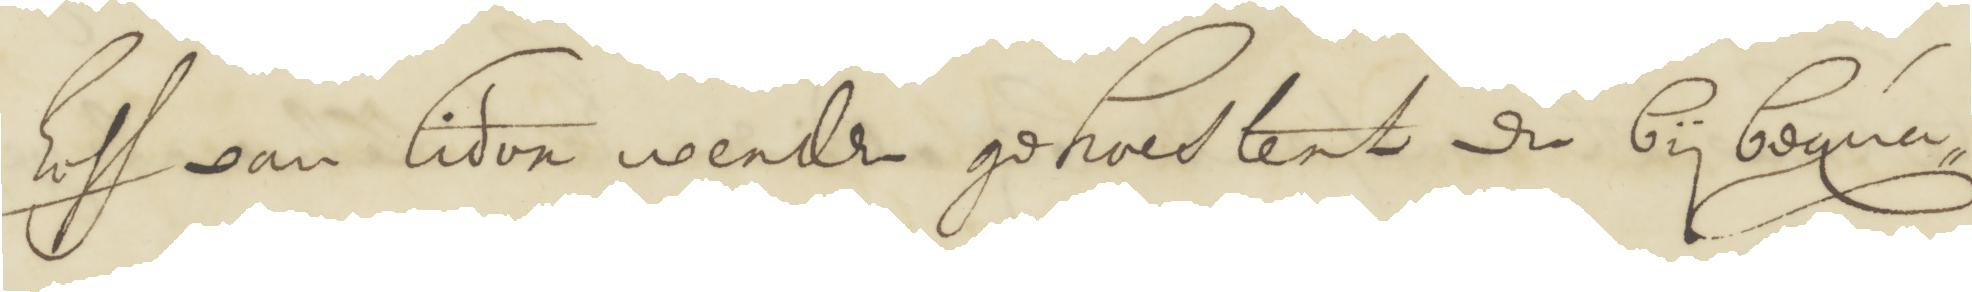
hoff van tidor werden gekoestert en bij bequa„
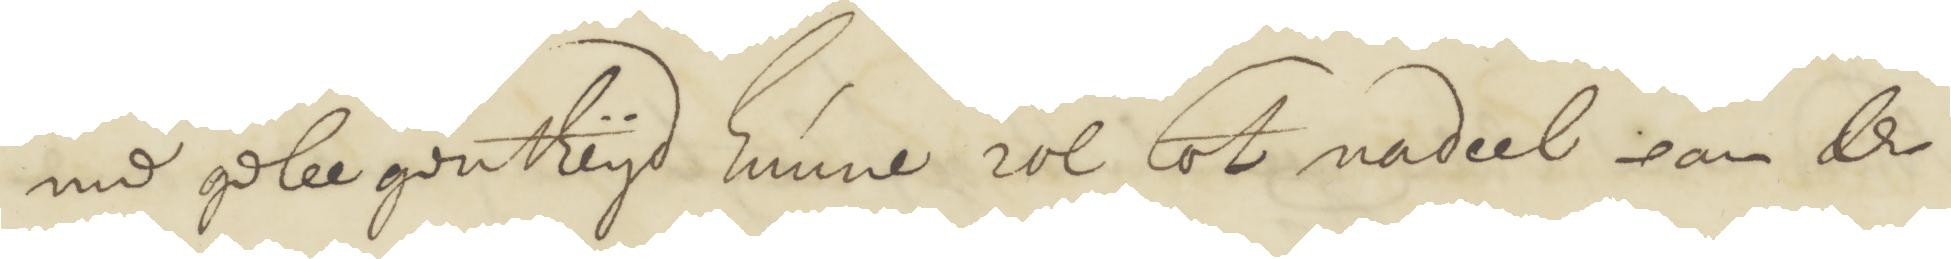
me geleegentheijd hunne rol tot nadeel van de
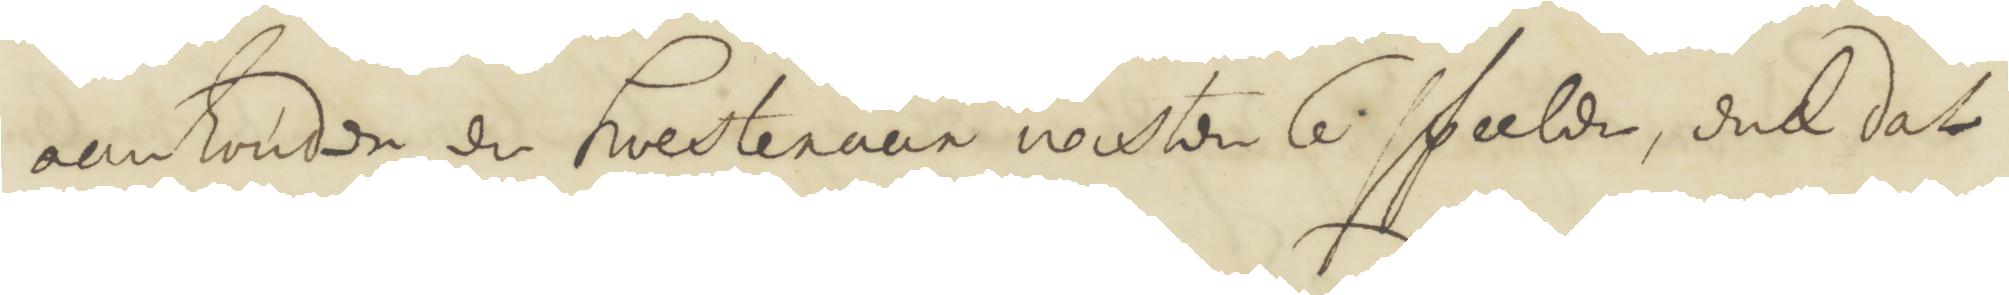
aanhouder en koesteraar wisten te speelen, end dat
